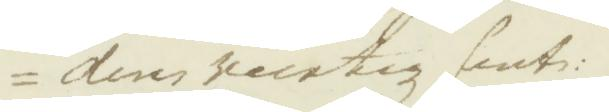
=dens veertig Cents:
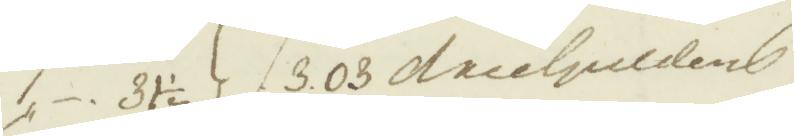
„ —. 31½ ] ƒ 3.03 drie Guldens
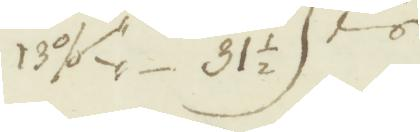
13% „ — 31½
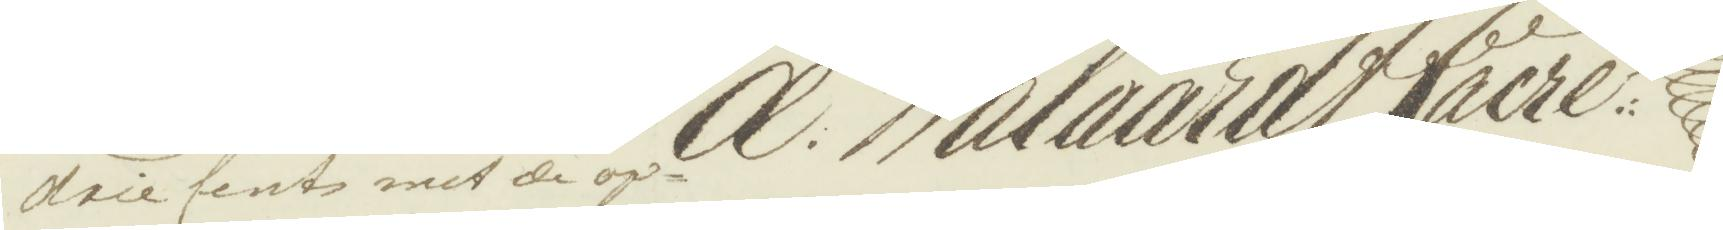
drie Cents met de op= AE. Walaardt Sacre.:
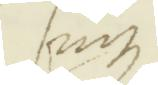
Crm
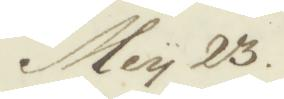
Meij 23.
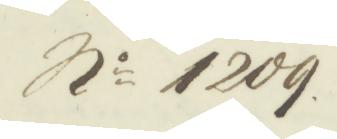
N=o 1209.
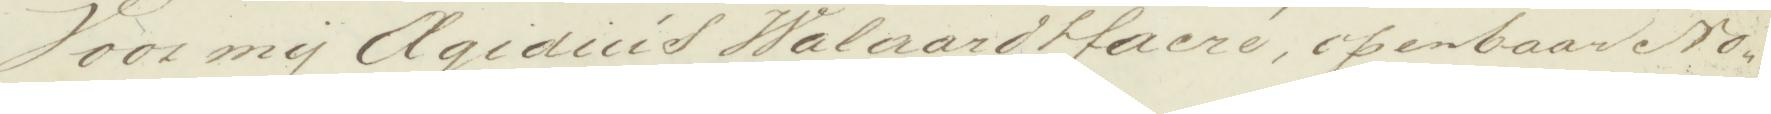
Voor mij AEgidius Walaardt Sacré. openbaar No„
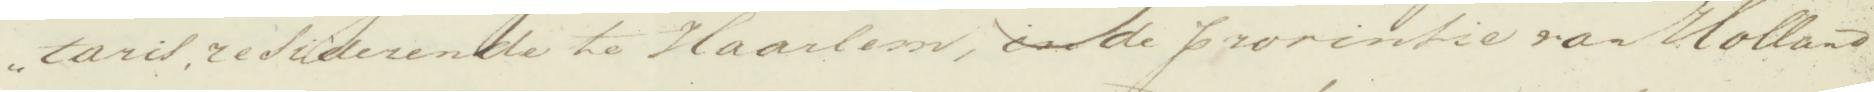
„taris, residerende te Haarlem, in de provintie van Holland
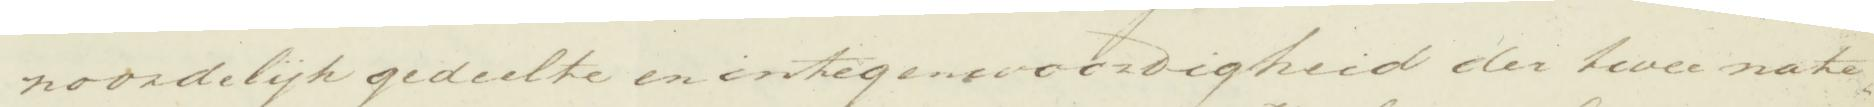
noordelijk gedeelte en integenwoordigheid der twee nate
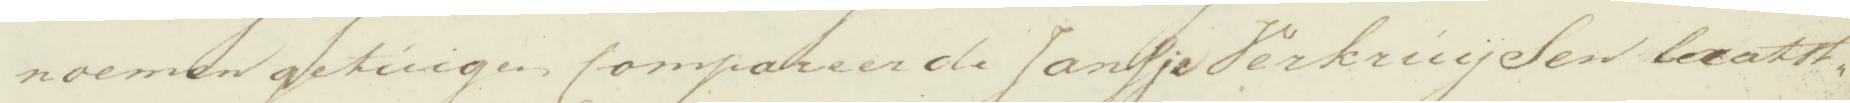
noemen getuigen Compareerde Jansje Verkruijsen laatst
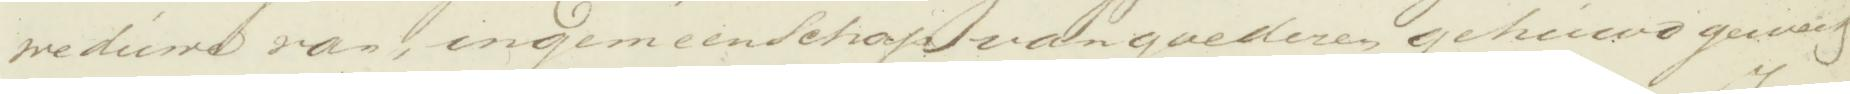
weduwe van, ingemeenschap van goederen gehuwd geweest
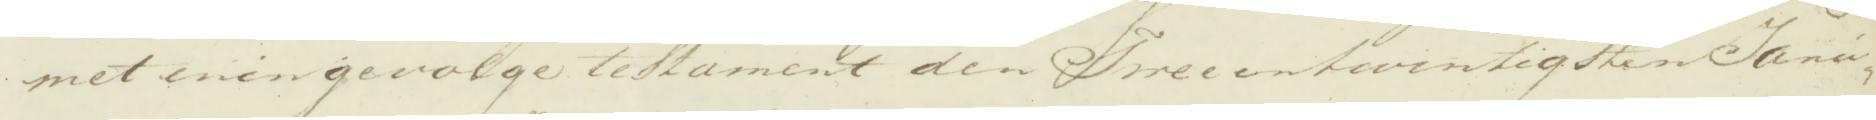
met en in gevolge testament den Twee en twintigsten Ianu
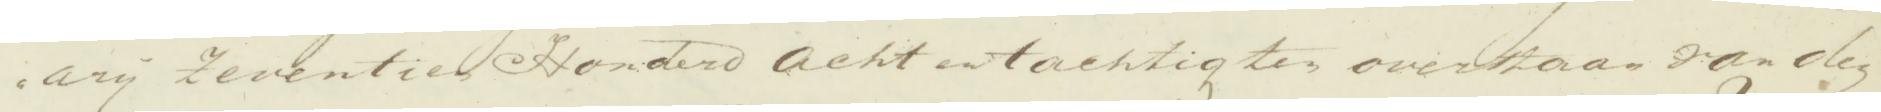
„arij Zeventien Honderd Acht en tachtig ten overstaan van den
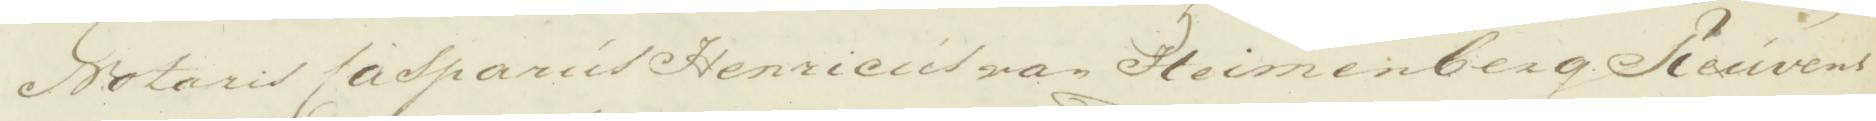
Notaris Casparus Henricus van Heimenberg Reuvens
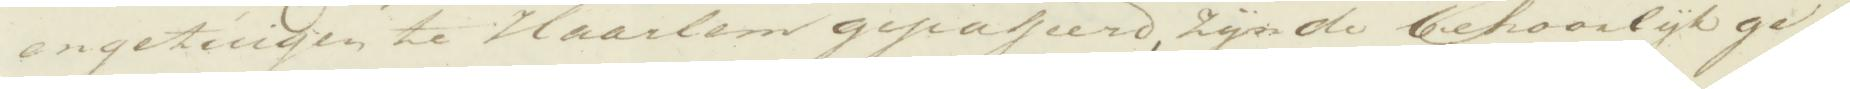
en getuigen te Haarlem gepasseerd, zijnde behoorlijk ge
